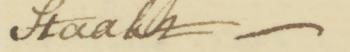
staakt —
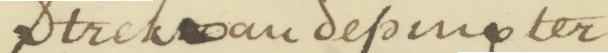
vertrek van de Pinxter
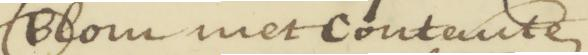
blom met contanten
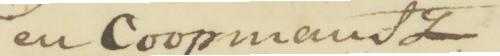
en Coopmansz
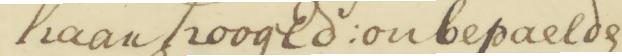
haar hoog Ed:s onbepaelde
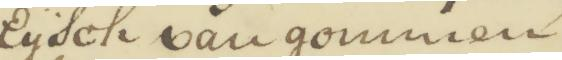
Eijsch van gommen
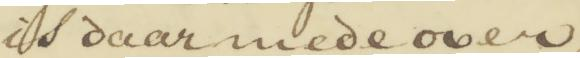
is daar mede over
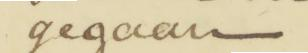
gegaan
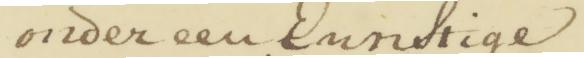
onder een Ernstige
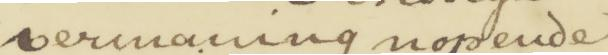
vermaning nopende
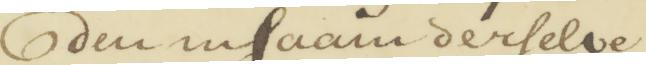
den insaam derselve
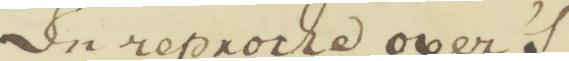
En reproche over 's
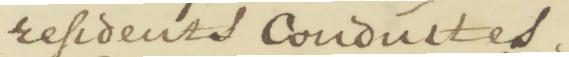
residents conduites
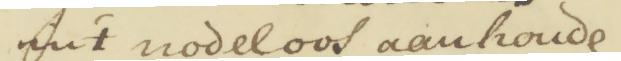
in't nodeloos aanhouden
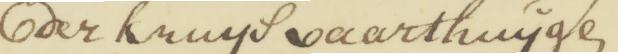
der kruysvaarthuijge
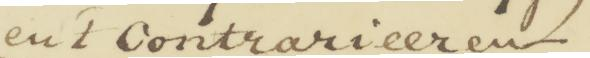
en 't contrarieeren
